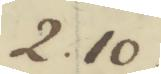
2. 10
